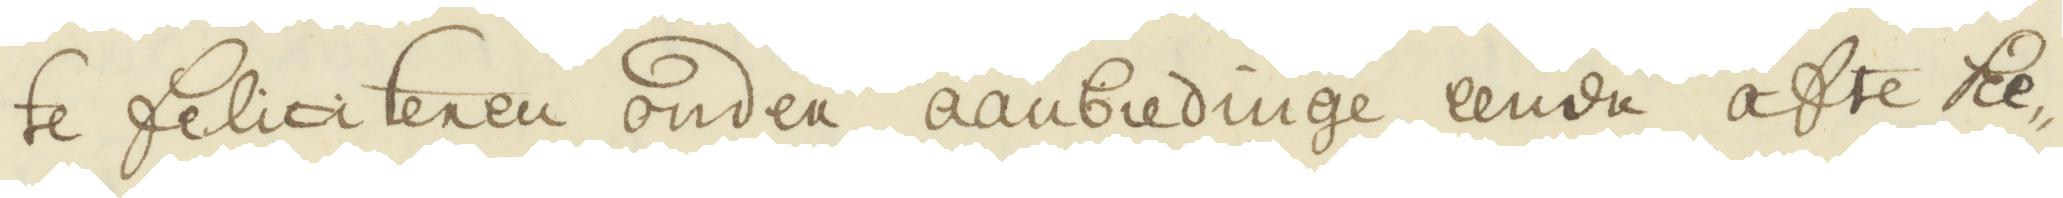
te feliciteren onder aanbiedinge eener afte ke„
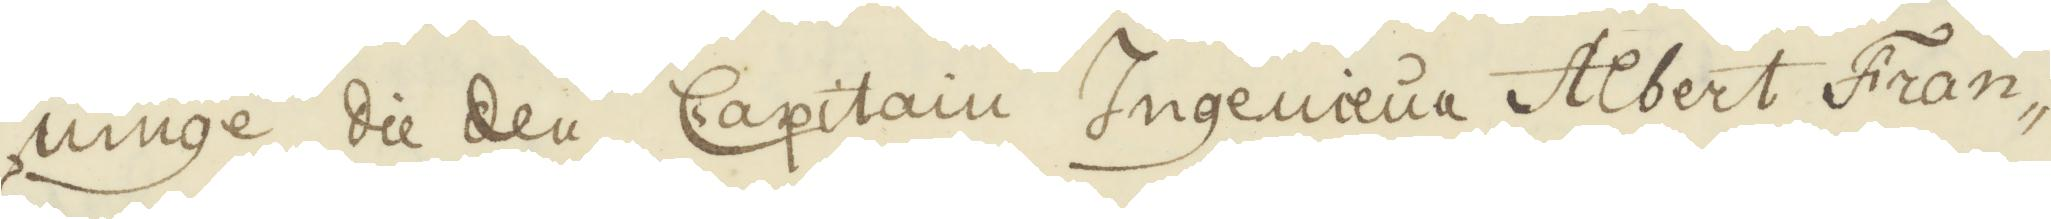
ninge die den Capitain Ingenieur Albert Fran„
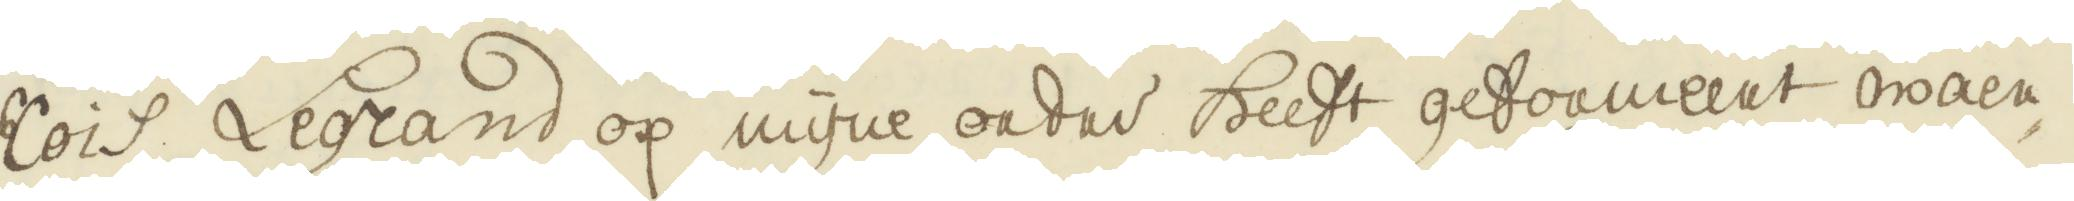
cois Legrand op mijne ordre heeft geformeert waer„
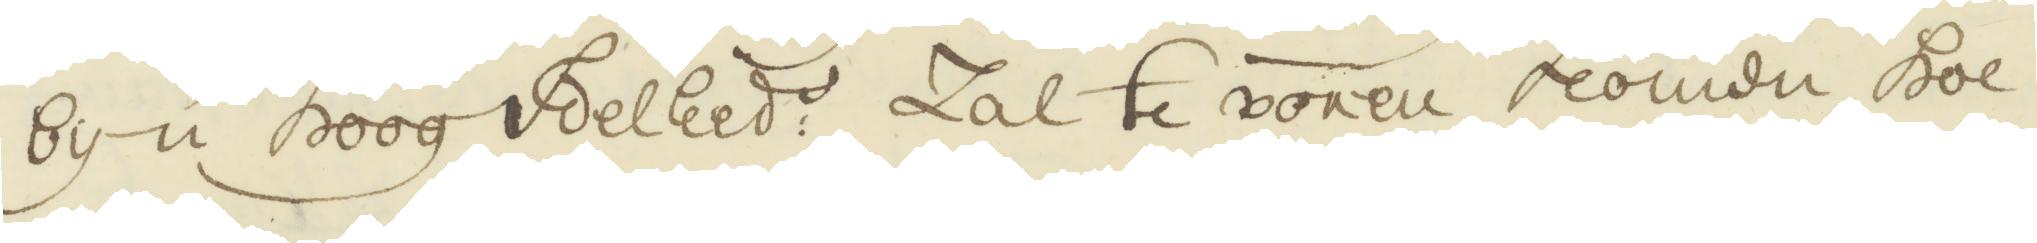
bij u hoog Edelhed:s zal te voren komen hoe
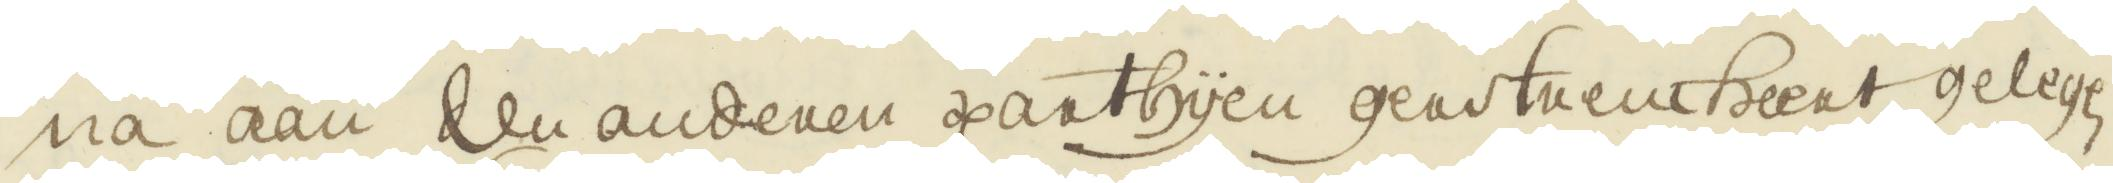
na aan den anderen parthijen geretrencheert gelegen
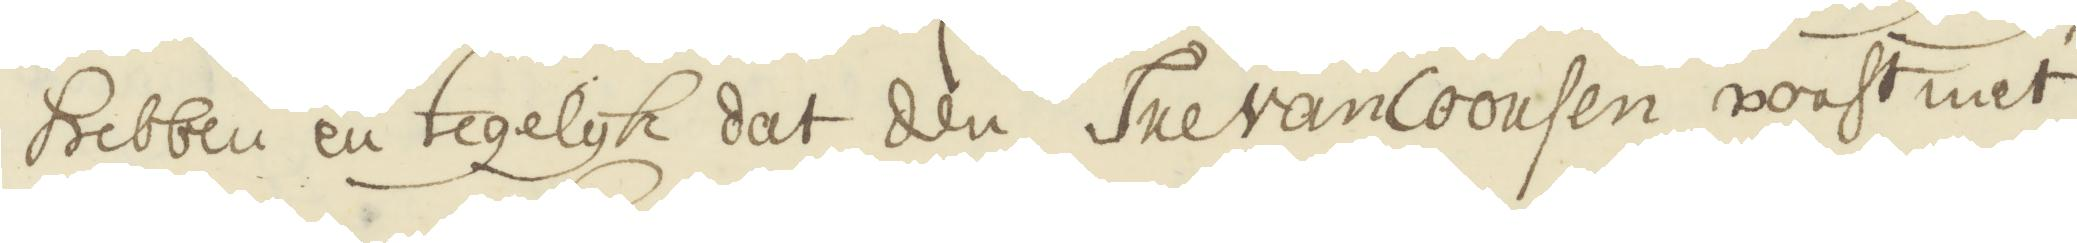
hebben en tegelijk dat den Trevancoorsen vorst met
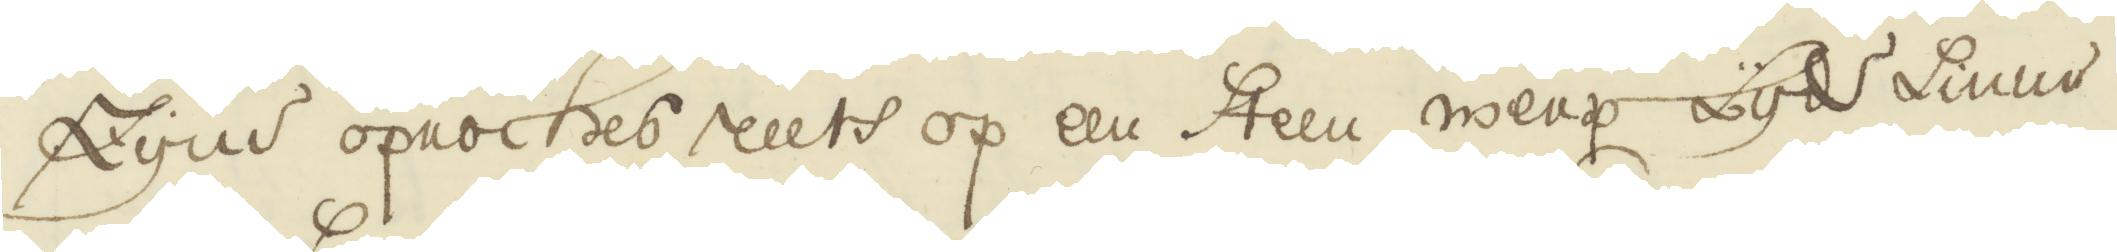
zijne oproches reets op een steen werp bijde binne
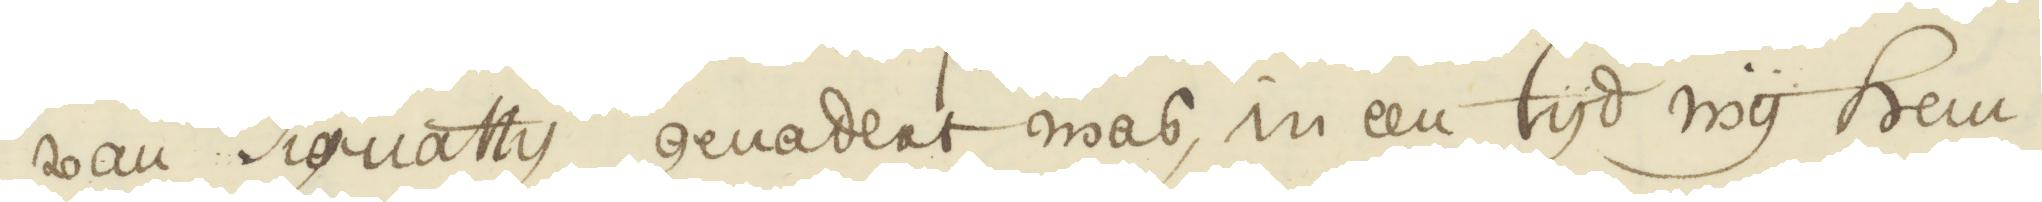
van Signatty genadert was, in een tijd wij hem
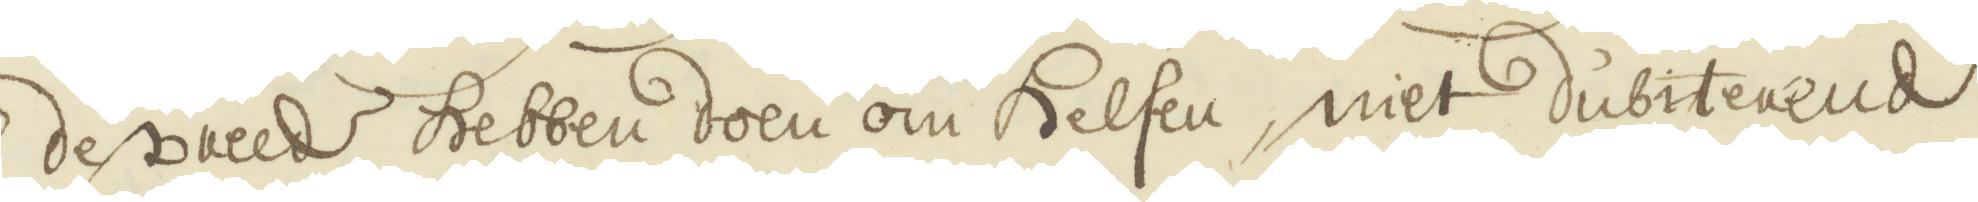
de vreede hebben doen om helsen, niet dubiterende
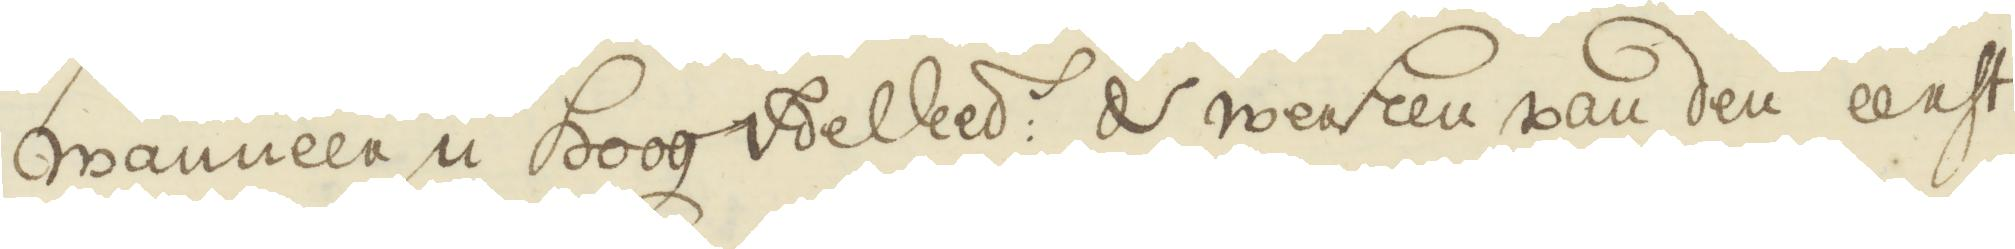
wanneer u Hoog Edelhed:s de werken van den eerst
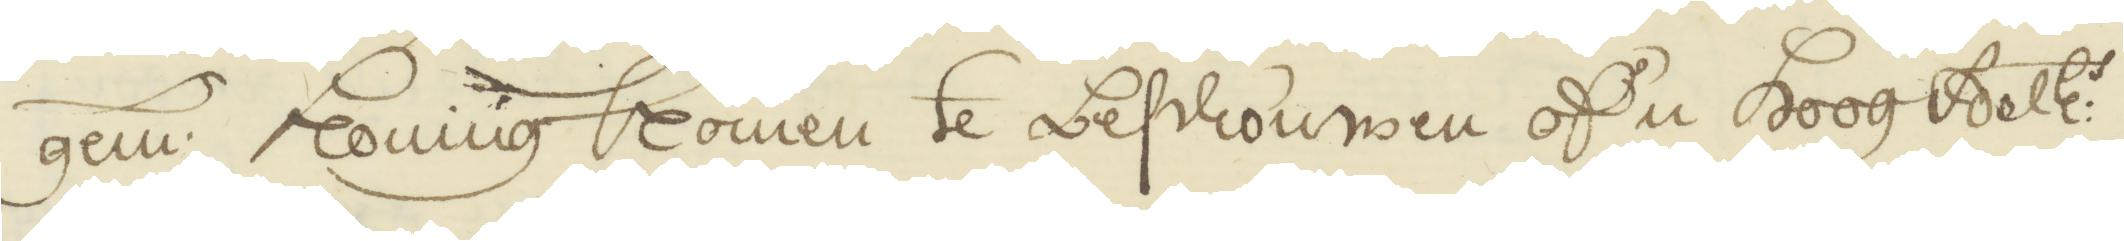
gem: koning komen te beschouwen of u Hoog Edelh:s
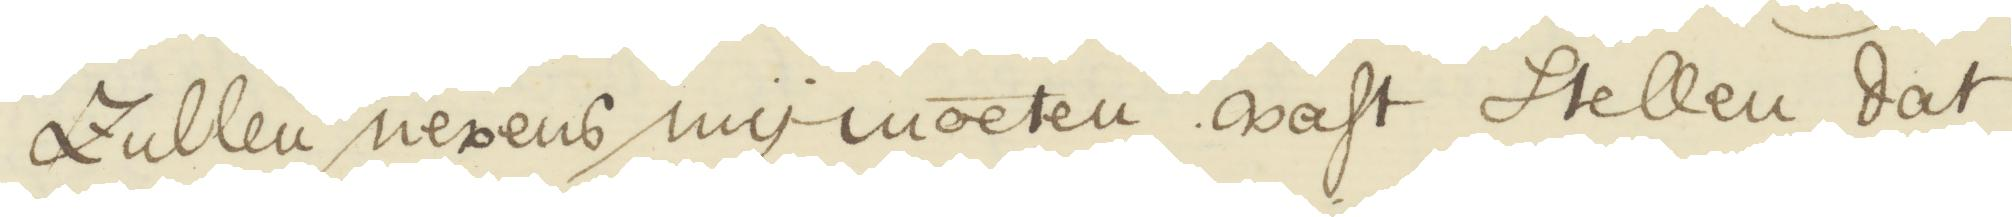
zullen nevens mij moeten vast stellen dat
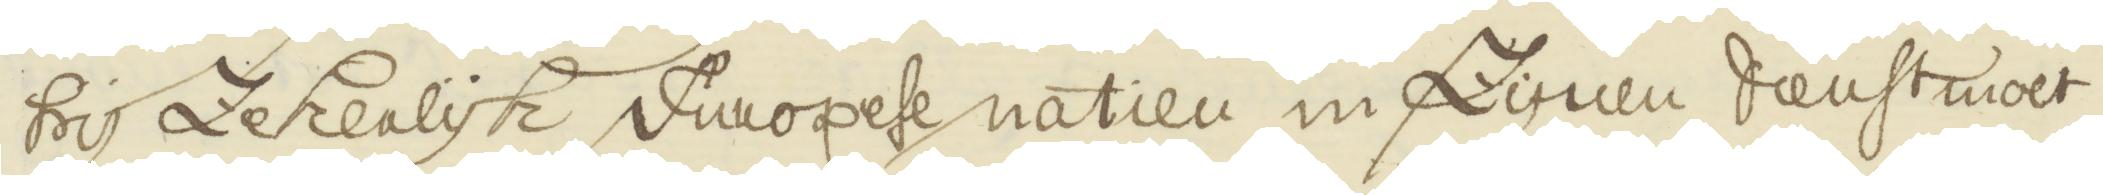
hij zekerlijk Europese natien in zijnen dienst moet
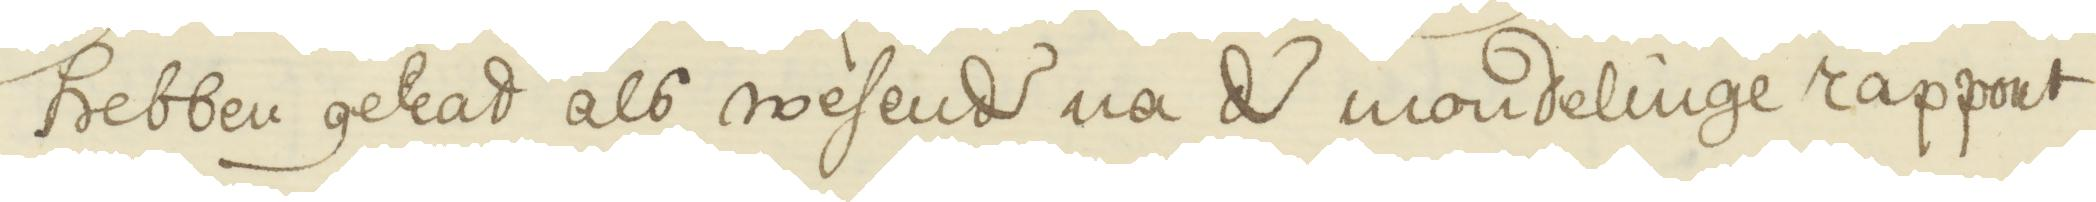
hebben gehad als wesende na de mondelinge rapport
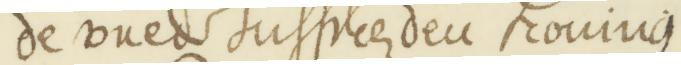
de vrede tusschen den koning
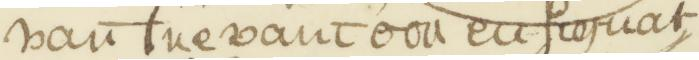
van trevancoor en signat„
